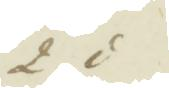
2 d
